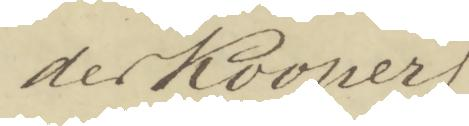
der Koopers
